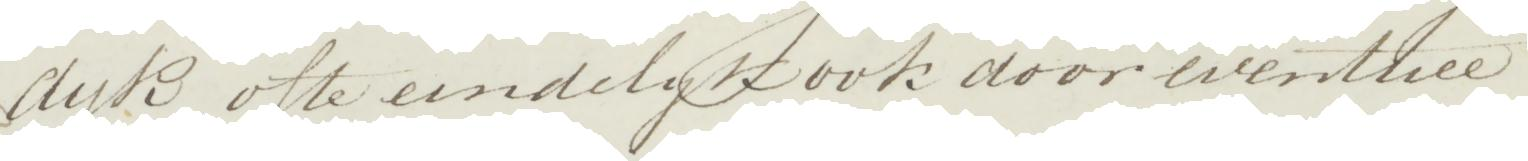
dyk ofte eindelyk ook door eventuee
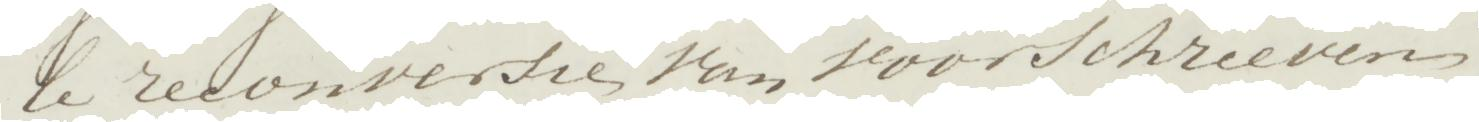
le reconversie van voorschreeven
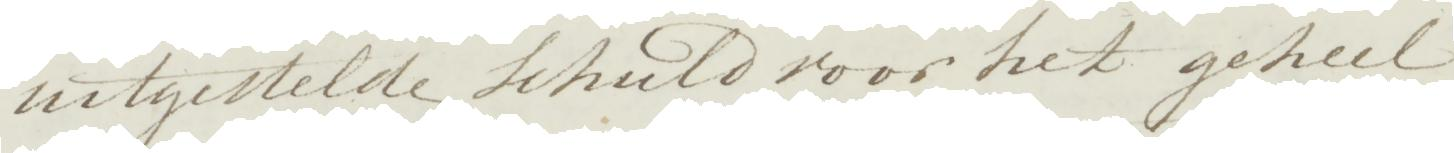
uitgestelde Schuld voor het geheel
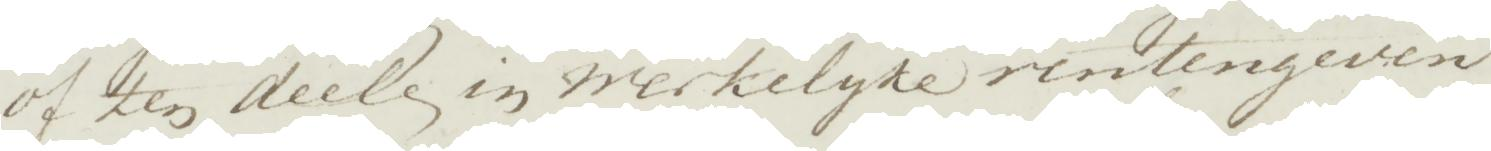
of ten deele in werkelyke renten geven;
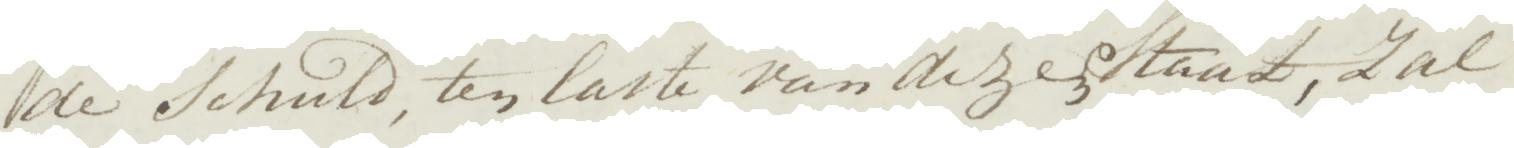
de schuld, ten laste van dezen Staat, Zal
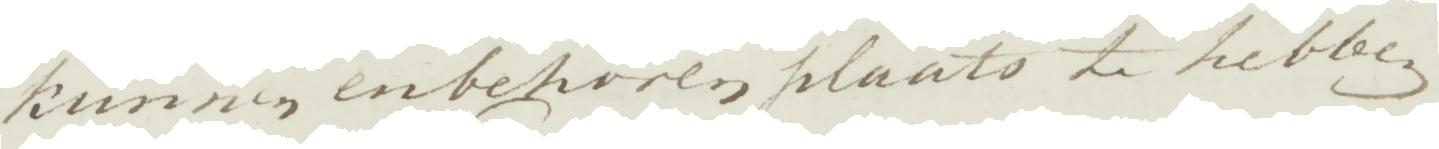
kunnen en behoren plaats te hebben
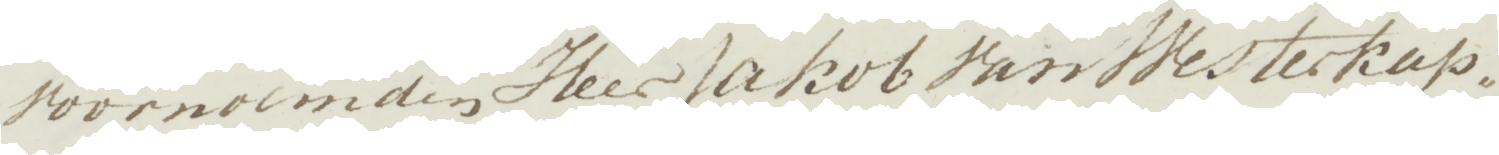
voornoemden Heer Jakob van Westerkap„
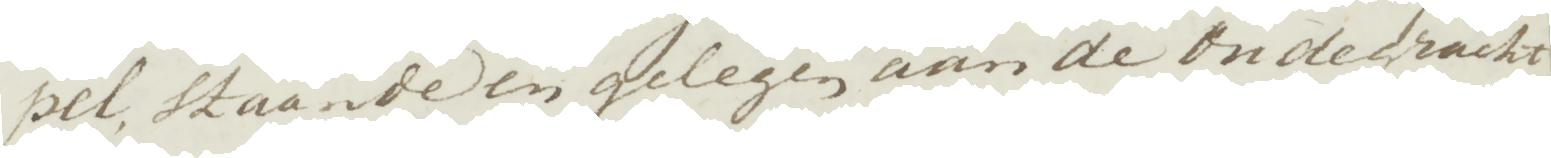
pel, staande en gelegen aan de Oude gracht
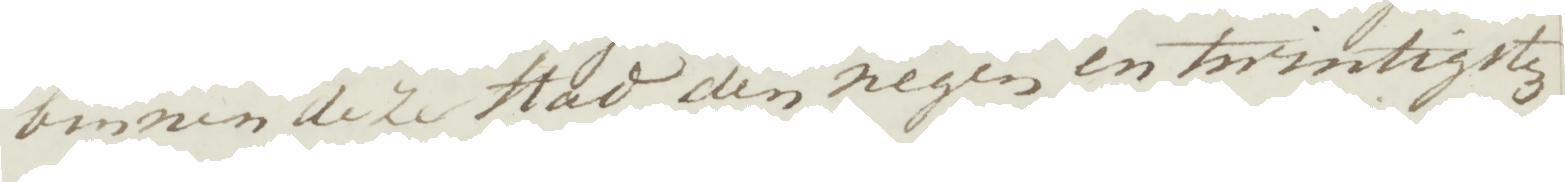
binnen deze stad, den negen en twintigsten
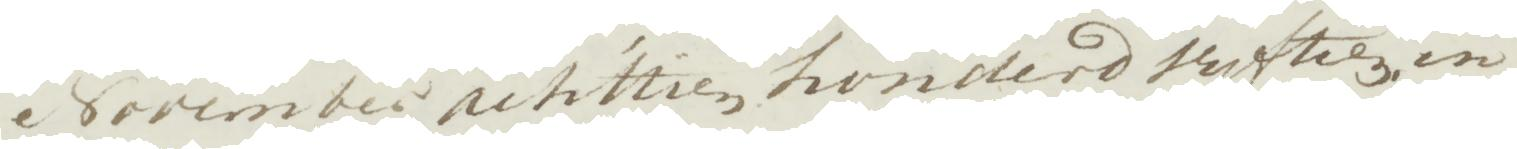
November achttien honderd vyftien, in
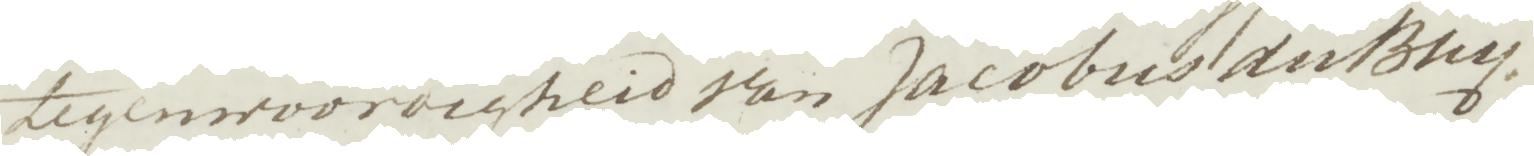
tigenwoordigheid van Jacobus du Buy,
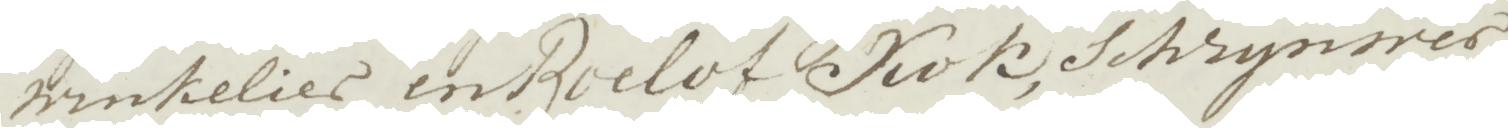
winkelier en Roelof Kok, Schrynwer=
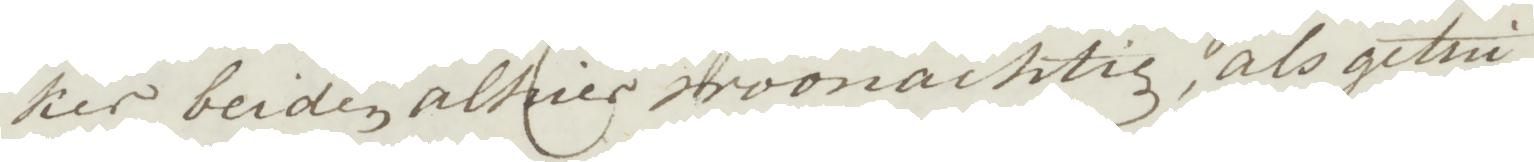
ker beiden alhier woonachtig, als getui
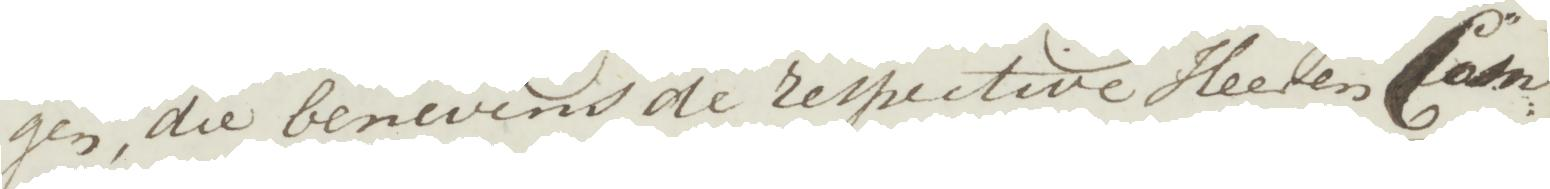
gen, die benevens de respective Heeren Com„
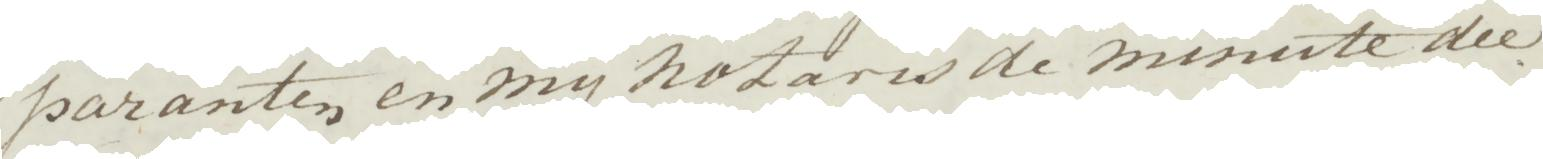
paranten en my notaris de minute dee.
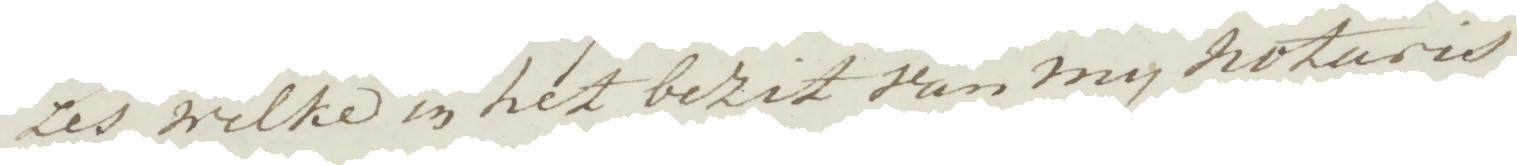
zes welke in het bezit van my notaris
